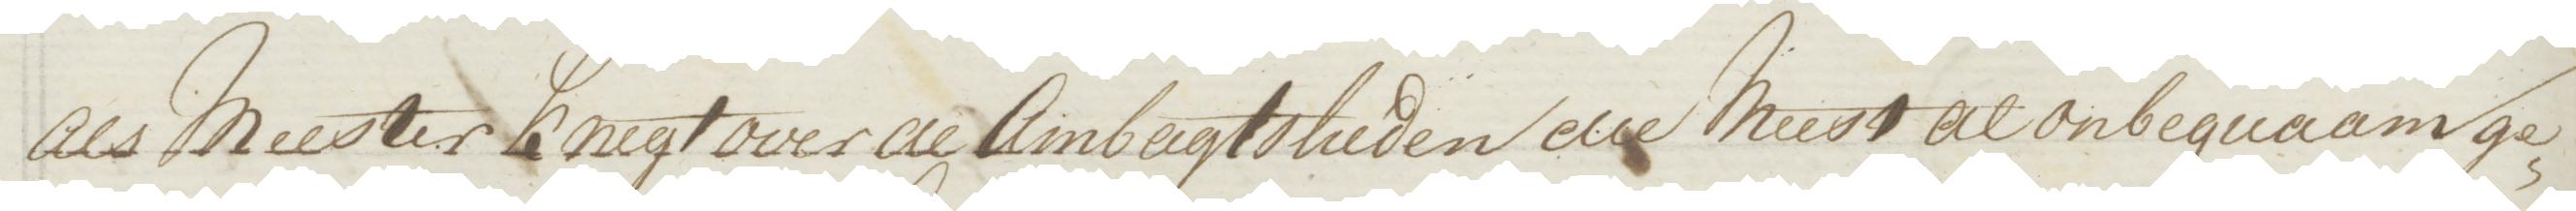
des Meester knegt over de Ambagtslieden die Meest al onbequaam ge„
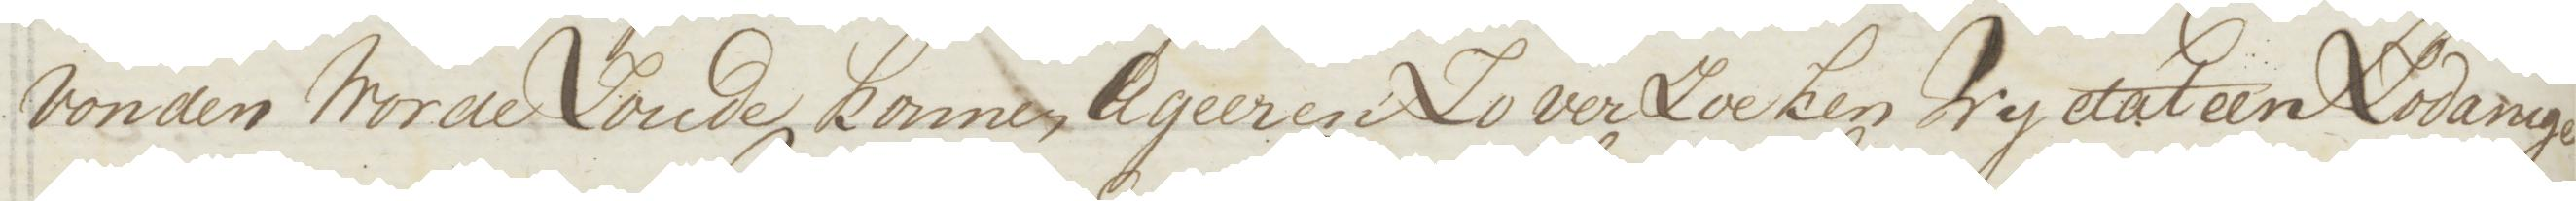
vonden worde zoude konnen ageeren zo verzoeken wy dat een zodanige
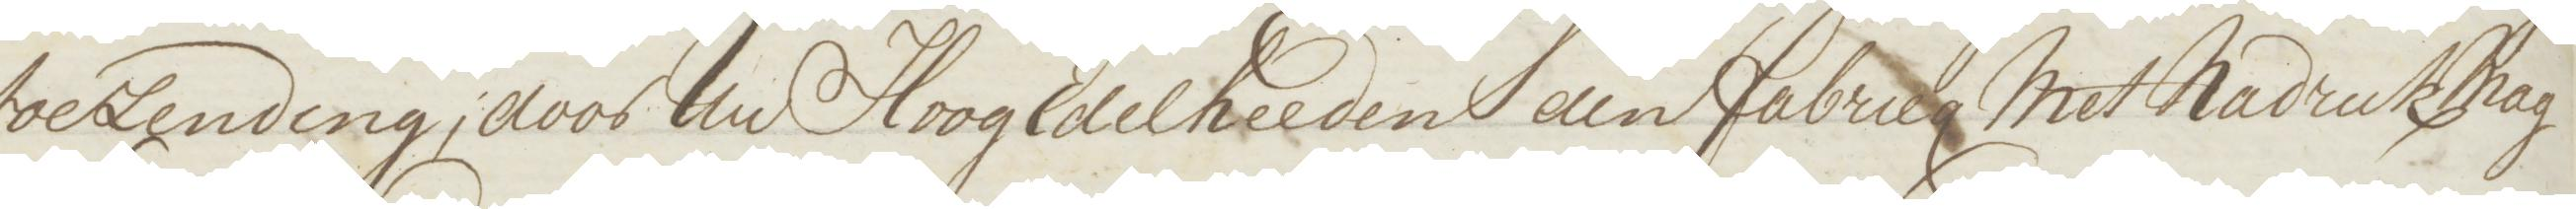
toezending; door Uw Hoog Edelheedens den fabrieq met nadruk mag
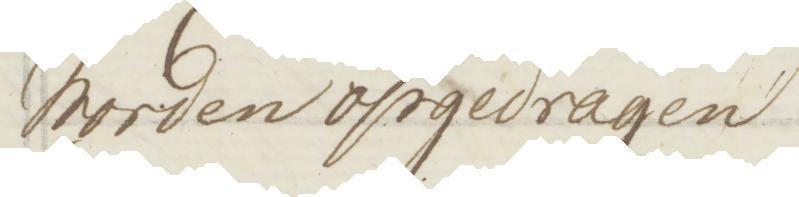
worden opgedragen
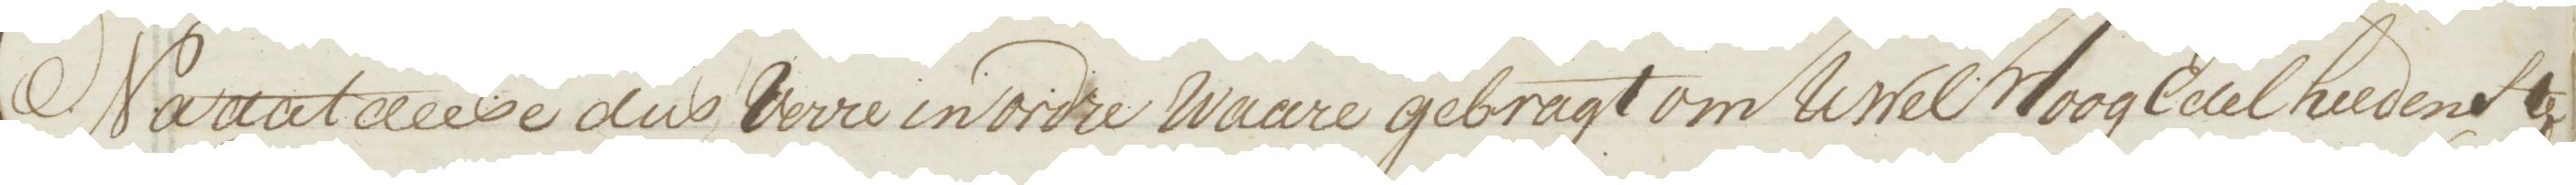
Na dat deese dus verre in ordre waare gebragt om uwel Hoog Edelheedens te
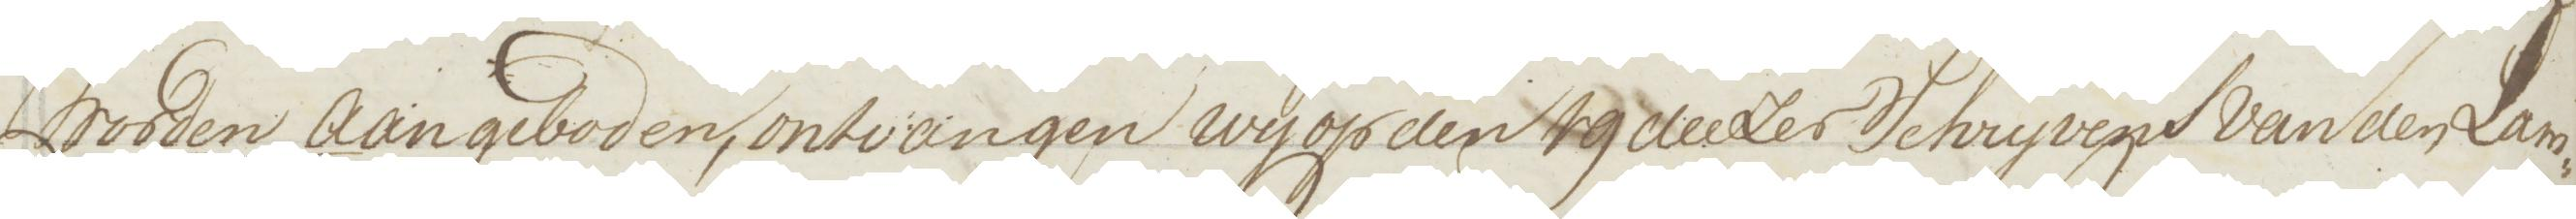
worden aangeboden, ontvangen wij op den 19 deezer schryvens van den Lam„
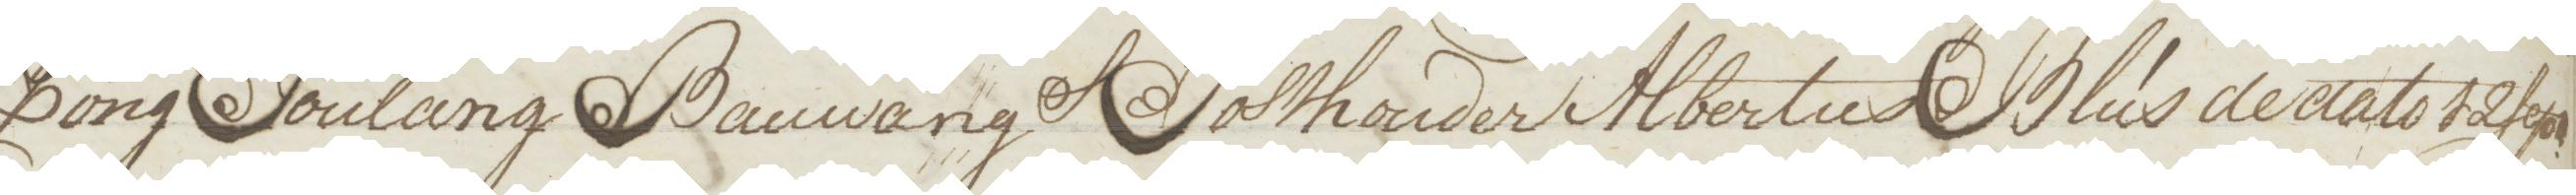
pong Toulang Bauwangs Posthouder Albertus Blus de dato 12 sept.
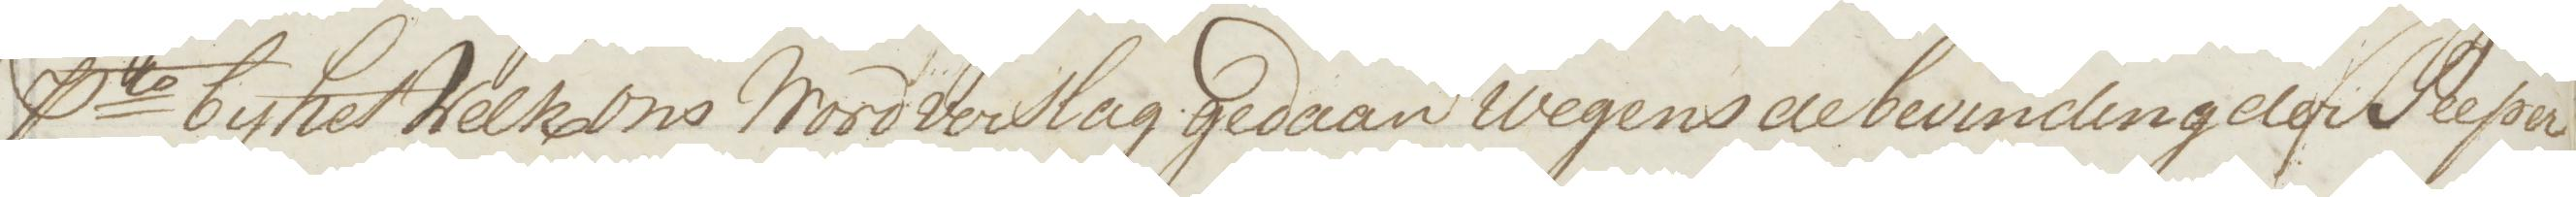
p=to by het welk ons word verslag gedaan wegens de bevinding der Peeper
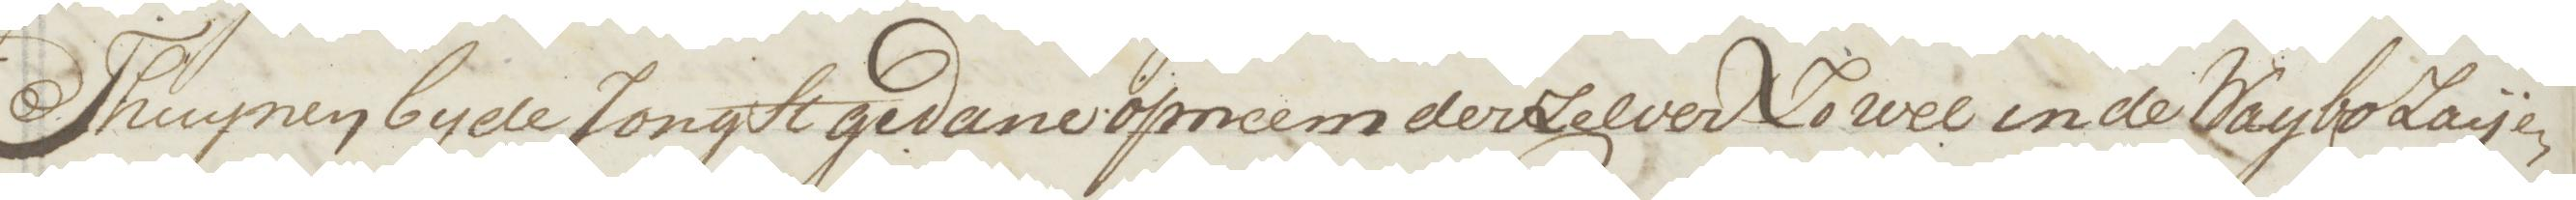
Thuynen byde Jongst gedane opneem derzelver zo wel in de Waybozaijen
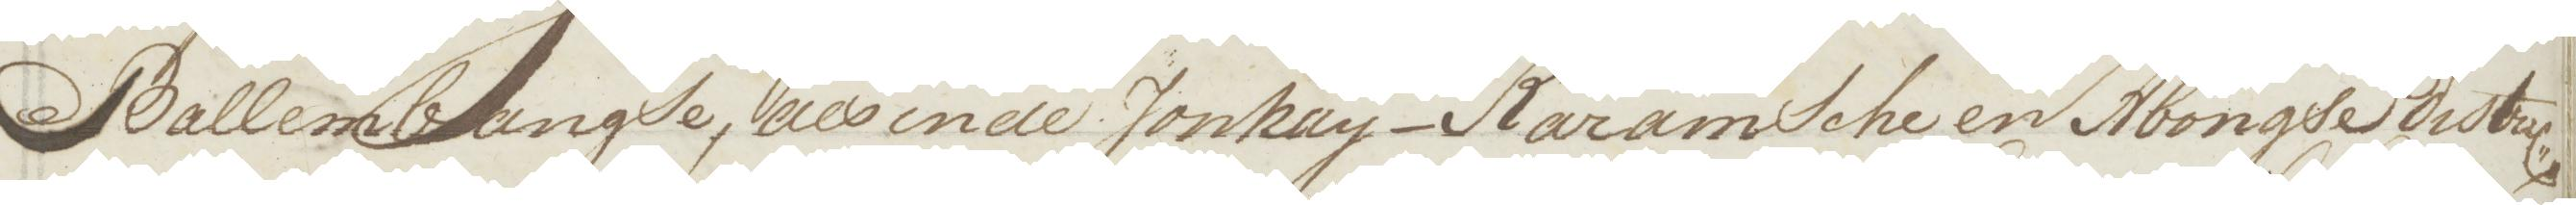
Ballembangse, als in de Jonkay-Raramsche en Abongse distric„
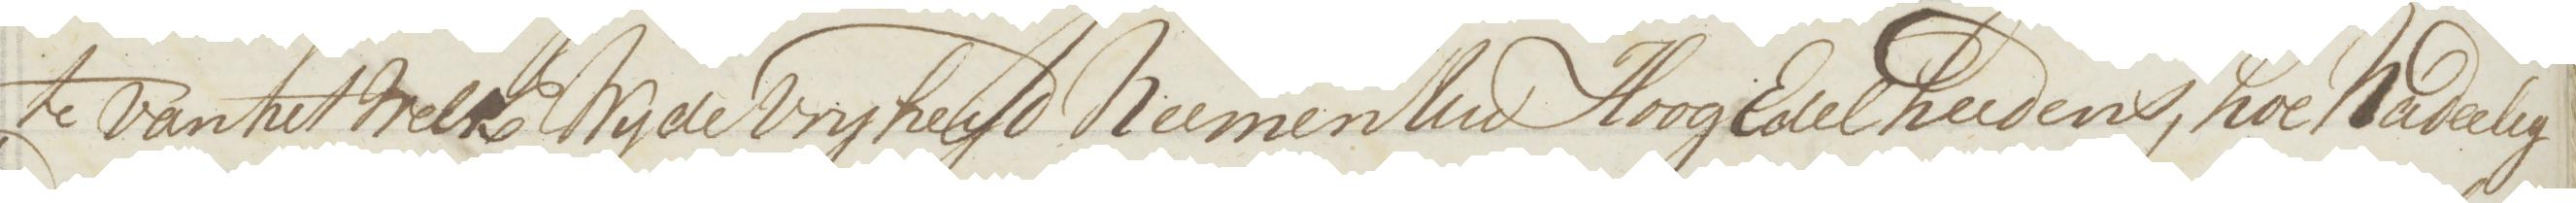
te van het welk Wy de vrijheid neemen uw Hoog Edelheedens, hoe nadeelig
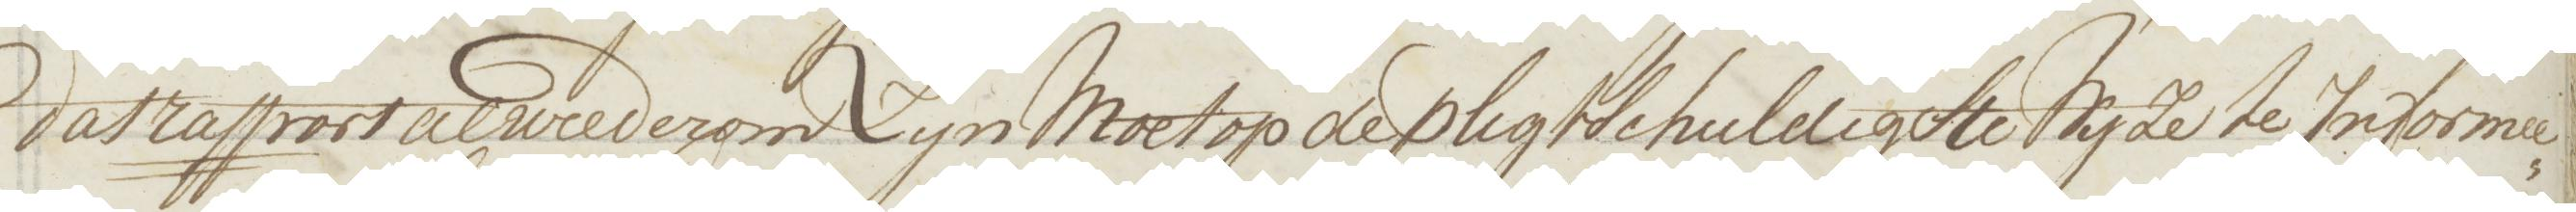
dat rapport al weederom zyn moet op de pligtschuldigste wijze te Jnformee„
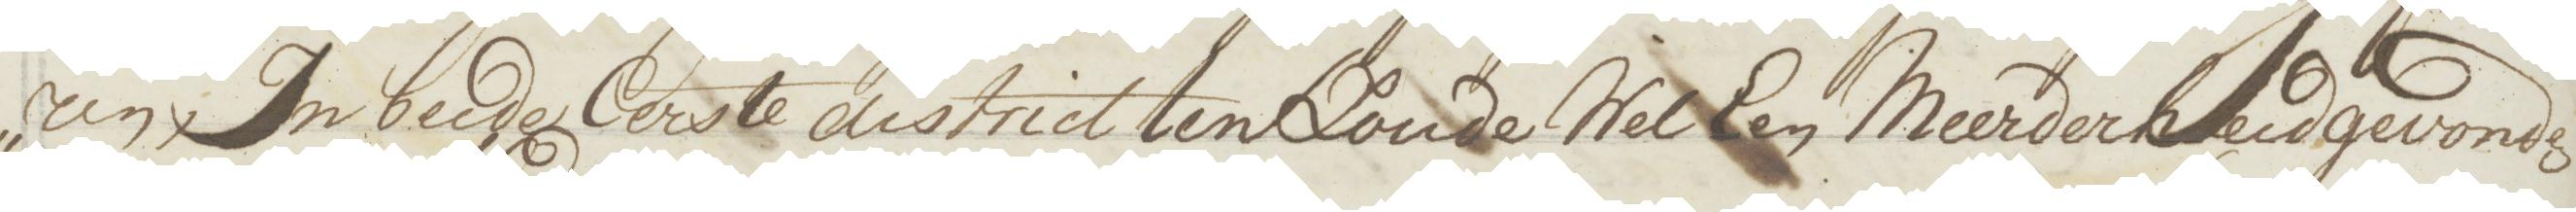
ren, In beide Eerste district ten zoude wel Een Meerderheid gevonden
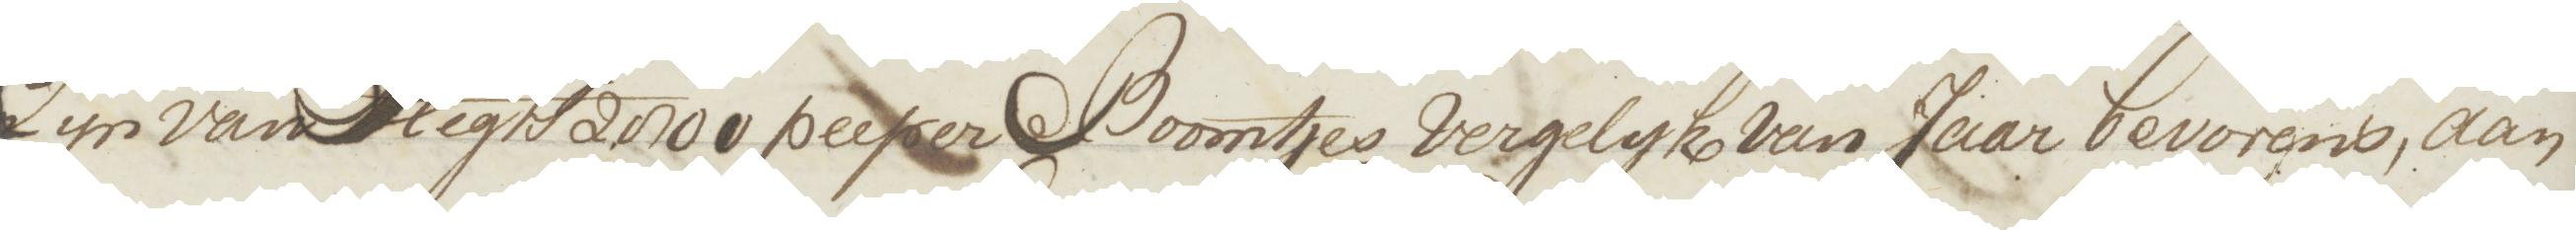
zyn van Slegts 2800 peeper Boomtjes vergelyk van Jaar bevorens, aan
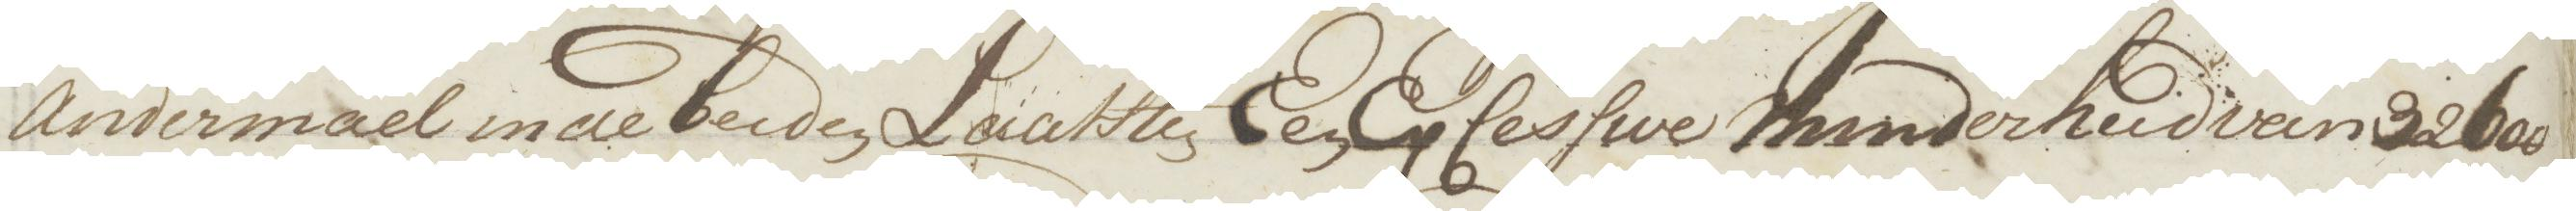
andermael in de beiden Laatsten Een Excessive minderheid van 32600
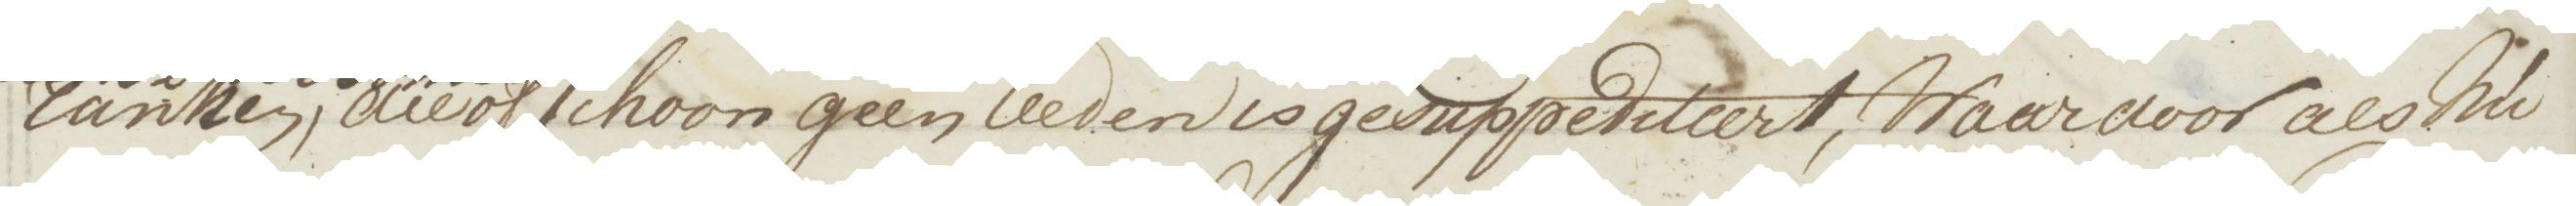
ranken, die ofschoon geen reeden is gesuppediteert, waardoor als nu
